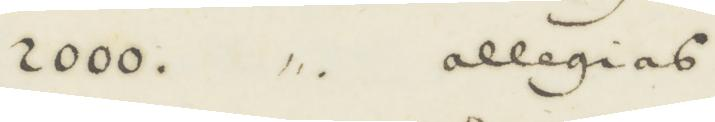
2000. „. allegias
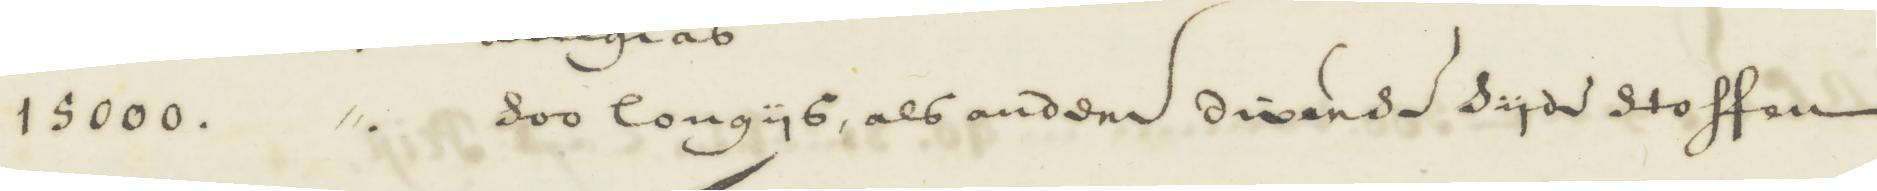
15000. „. soo longijs, als andere diverse sijde stoffen
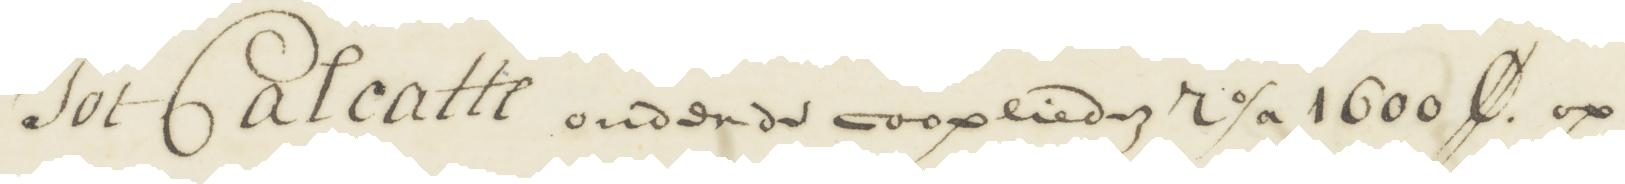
Tot Calcatte onder de cooplieden r o/a 1600 Ø op
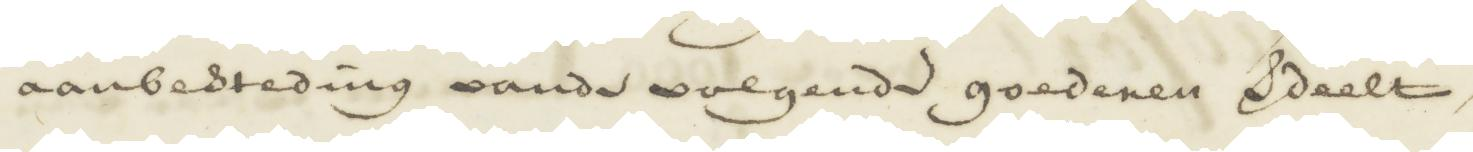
aanbesteding vande volgende goederen verdeelt
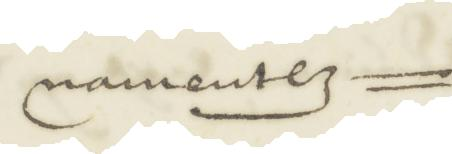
namentlijk=
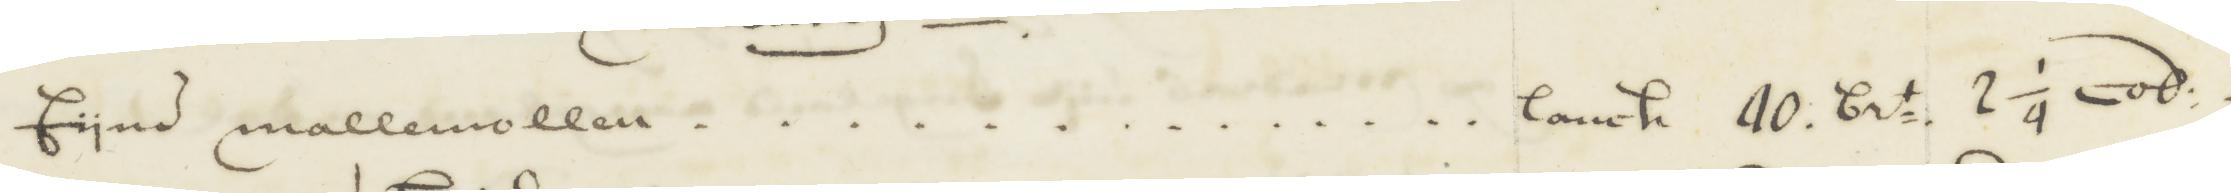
fijne mallemollen - - - - - - - - - - - - - - lanck 40. br=t. 2¼ cod:
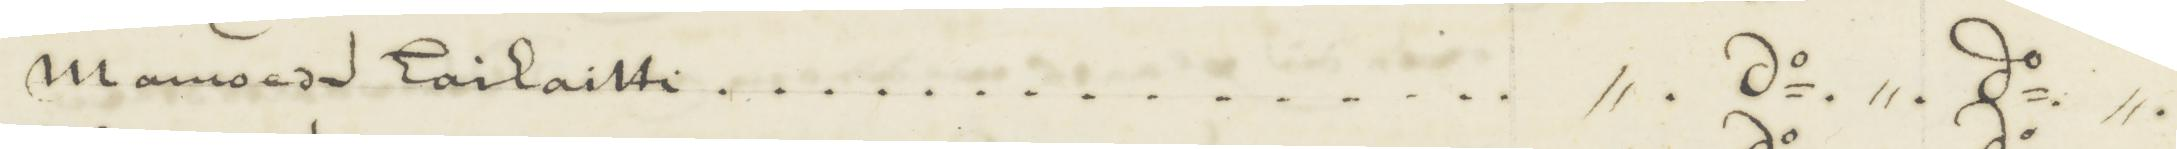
Mamoede hailaitti - - - - - - - - - - - - - - - „ . d=o. „ . d=o. „.
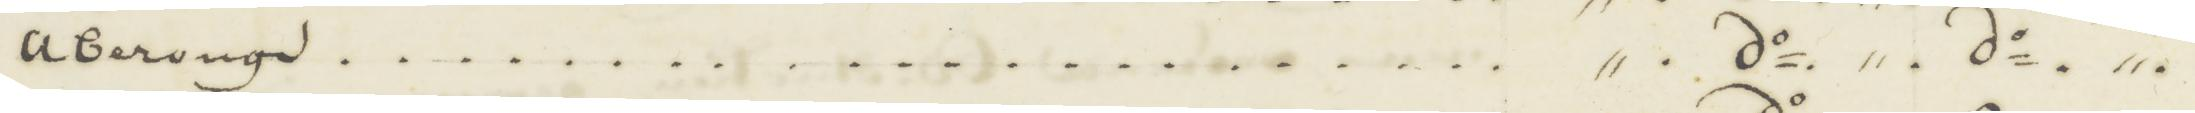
aberonge - - - - - - - - - - - - - - - - - - - - - - „ . d=o. „ . d=o . „.
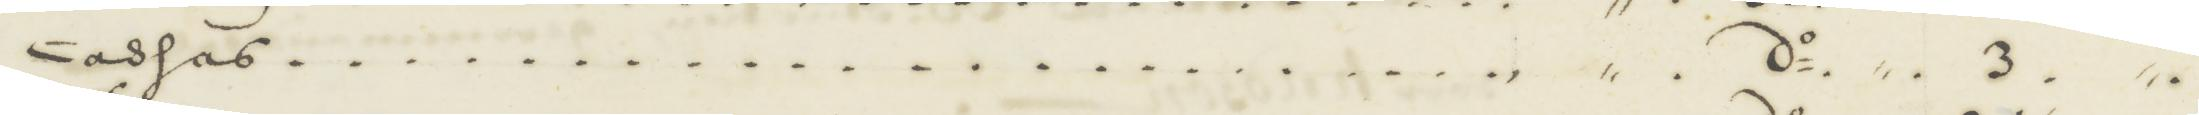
Cassas - - - - - - - - - - - - - - - - - - - - - - - - „ . d=o. „ . 3 . „.
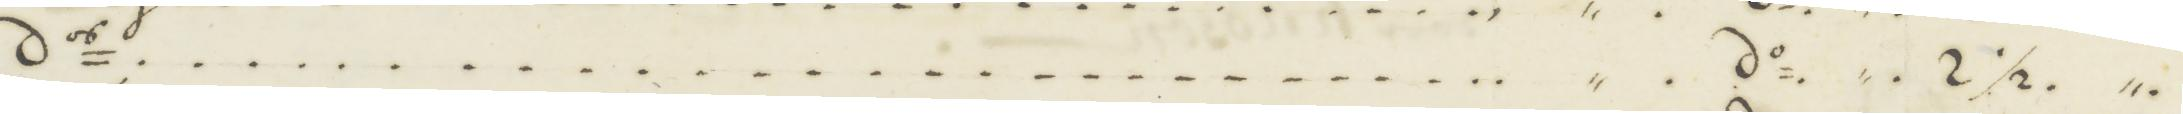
d=os - - - - - - - - - - - - - - - - - - - - - - - - - - - „ . d=o. „ . 2½. „.
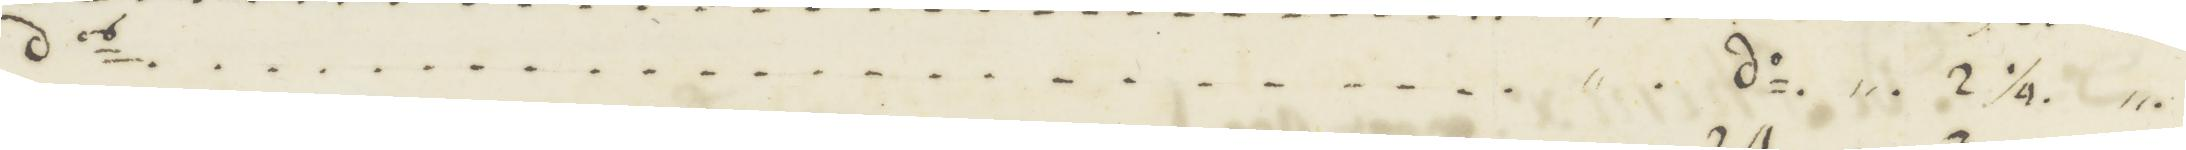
d=os - - - - - - - - - - - - - - - - - - - - - - - - „ . d=o. „ . 2¼. „.
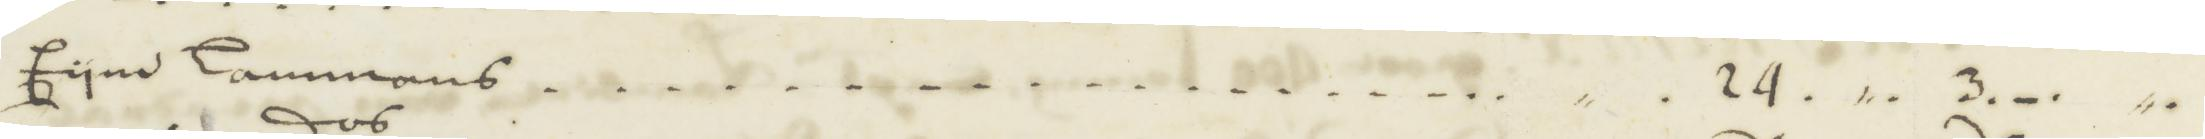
fijne hammans - - - - - - - - - - - - - - - - - - - „ . 24. „ . 3._. „.
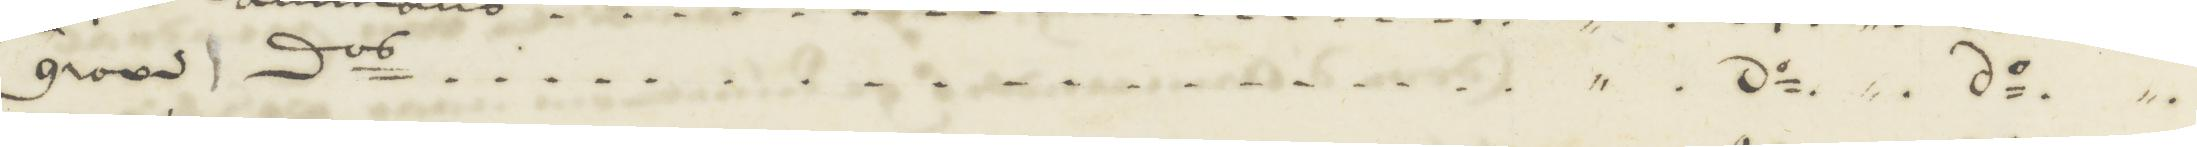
grove D=os - - - - - - - - - - - - - - - - - - - „ .d=o. „ . d=o. „.
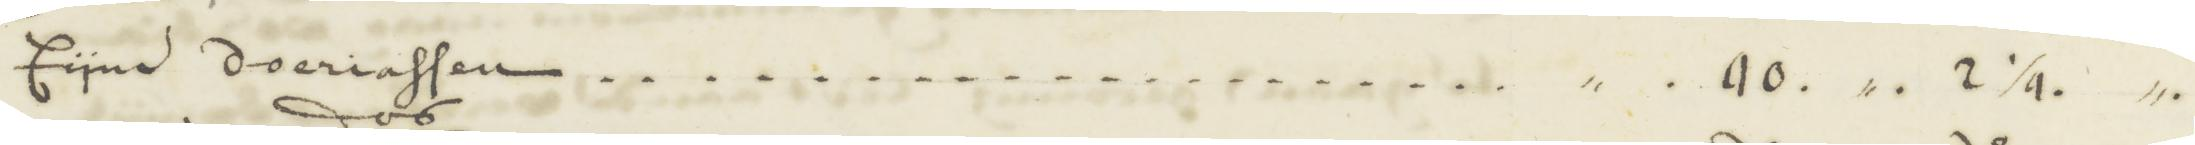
fijne doeriassen - - - - - - - - - - - - - - - - - - - - „ . 40. „ . 2¼. „.
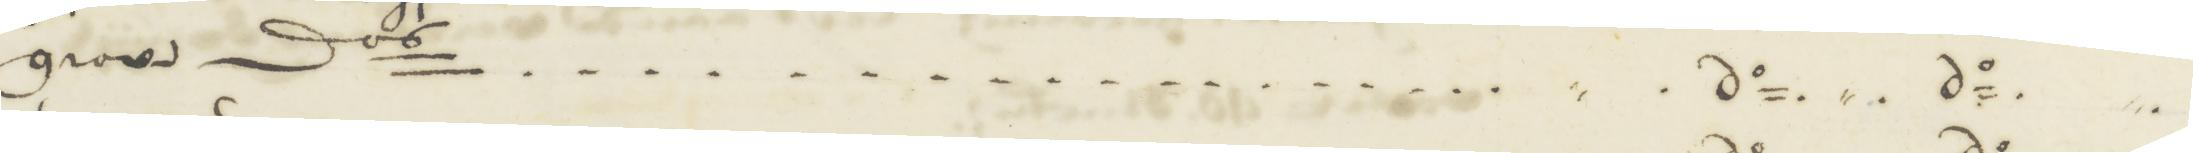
grove D=os - - - - - - - - - - - - - - - - - - „ . d=o. „ . d=o. „.
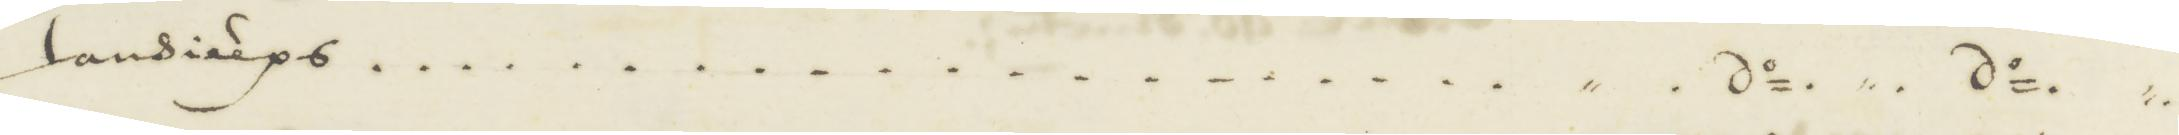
tansireps - - - - - - - - - - - - - - - - - - - - „ . d=o. „ . d=o. „
